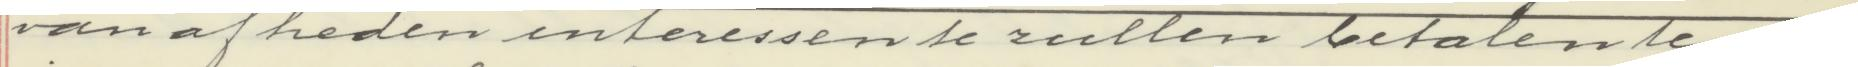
van af heden interessen te zullen betalen
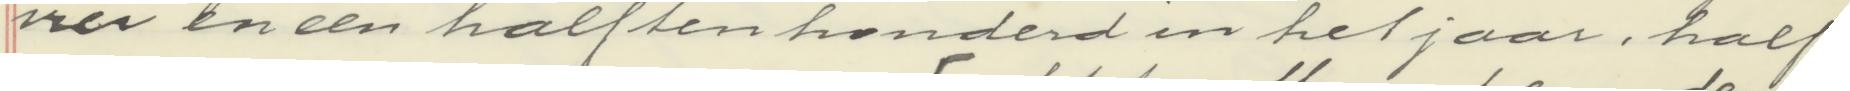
vier en een half ten honderd in het jaar, half-
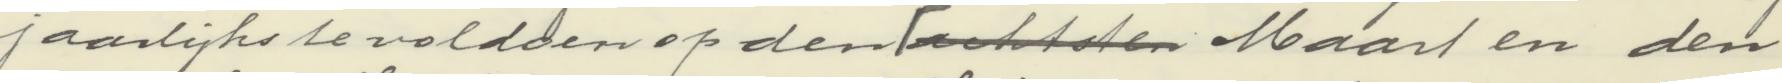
jaarlijks te voldoen op den achtsten Maart en den
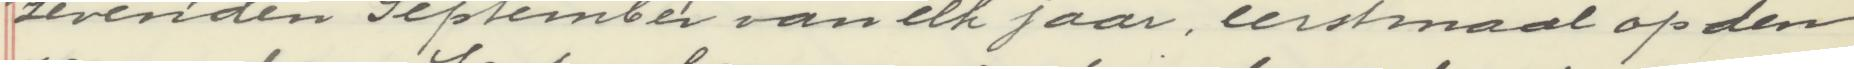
zevenden September van elk jaar, eerstmaal op den
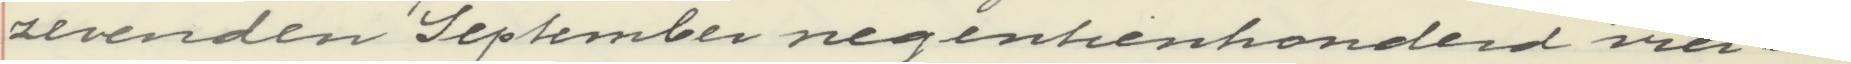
zevenden September negentienhonderd vier en
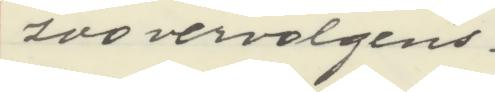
zoo vervolgens
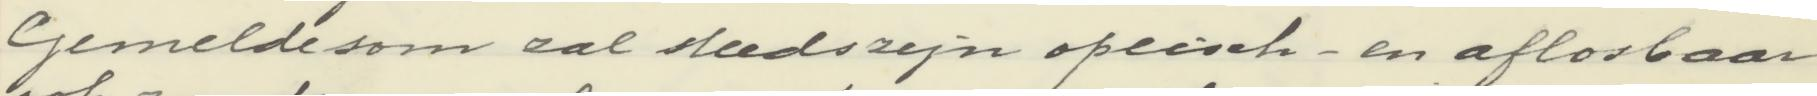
Gemelde som zal steeds zijn opeisch - en aflosbaar
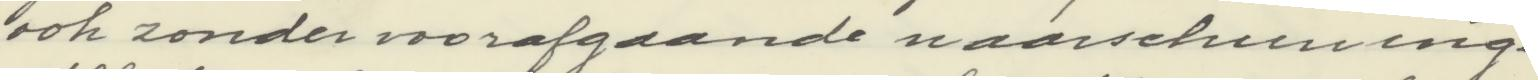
ook zonder voorafgaande waarschuwing
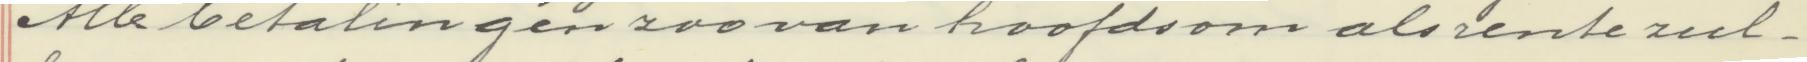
Alle betalingen zoo van hoofdsom als rente zul-
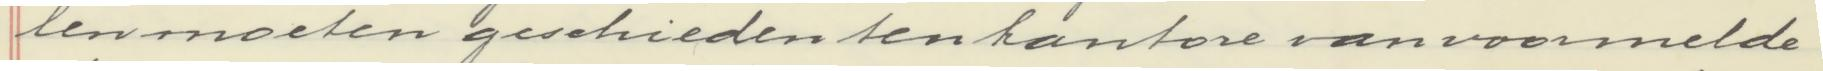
len moeten geschieden ten kantore van voormelde
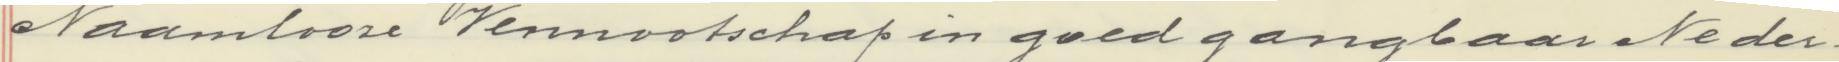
Naamlooze Vennootschap in goed gangbaar Neder
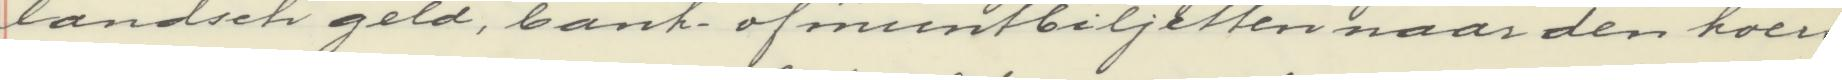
landsch geld, bank- of muntbiljetten naar den koer
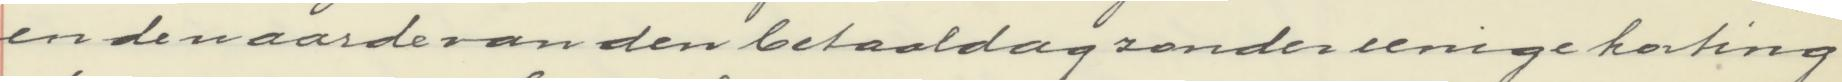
en de waarde van den betaaldag zonder eenige korting
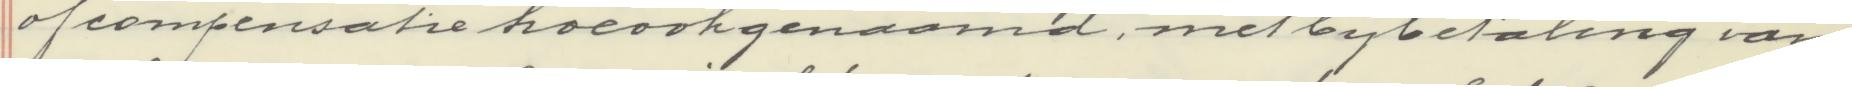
of compensatie hoe ook genaamd, met bijbetaling van
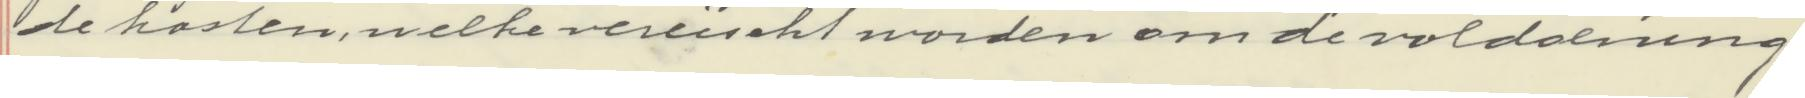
de kosten, welke vereischt worden om de voldoening
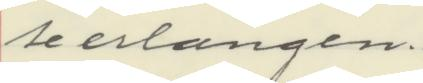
te erlangen
